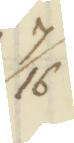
7/16
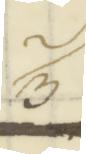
2/3
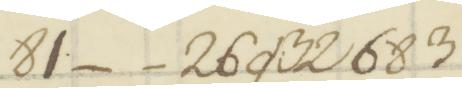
81 – – 26932 68 3
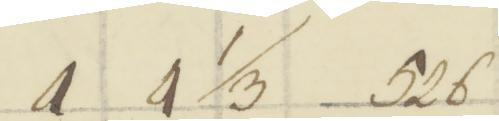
4 4 1/3 - 526
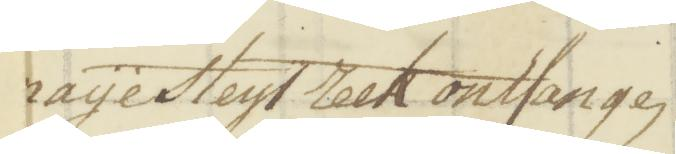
aijesteyt reets ontfangen
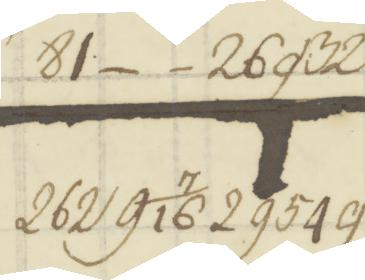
262 9 7/16 29549
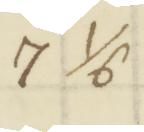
7 1/6
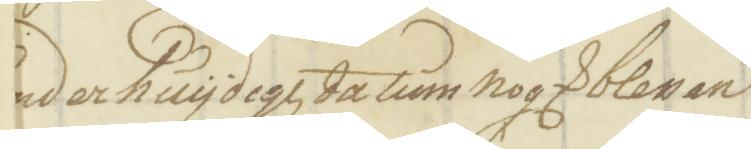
der huijdege datum nog verbleven
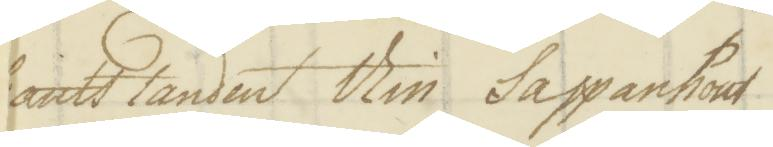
ants tanden thin sappanhout
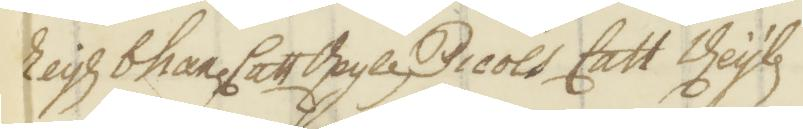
heijen bharen Catt theylen Picols Catt theijlen
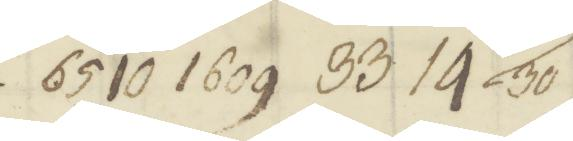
6510 1609 33 14 1/30
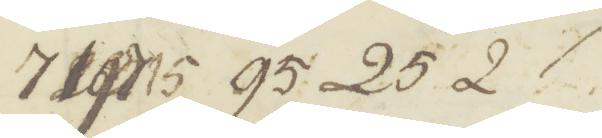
719715 95 25 2
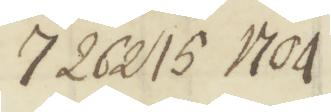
726215 1704
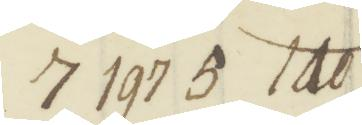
7 197 5 140
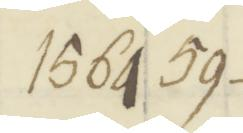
1564 59
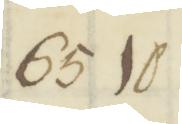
65 10
